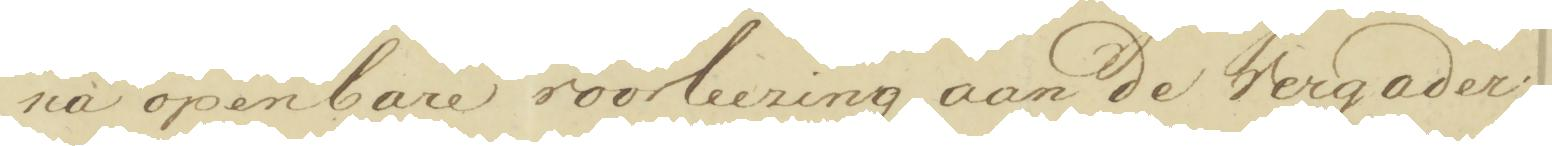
na openbare voorleezing aan de Vergader„
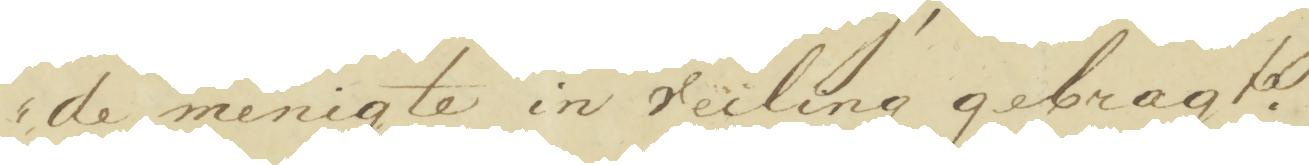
„de menigte in Veiling gebragt.
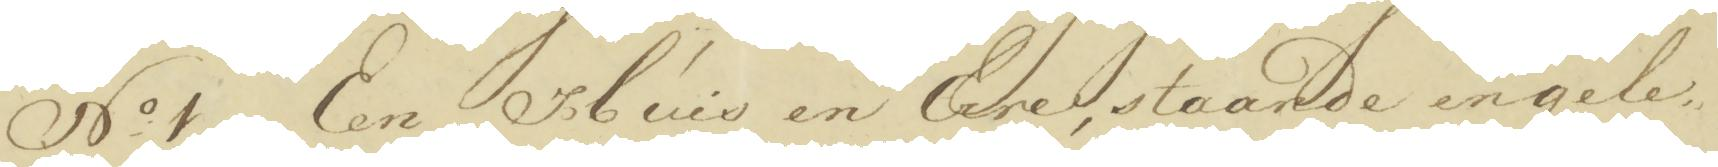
N:o 1 Een Huis en Erve, staande en gele„
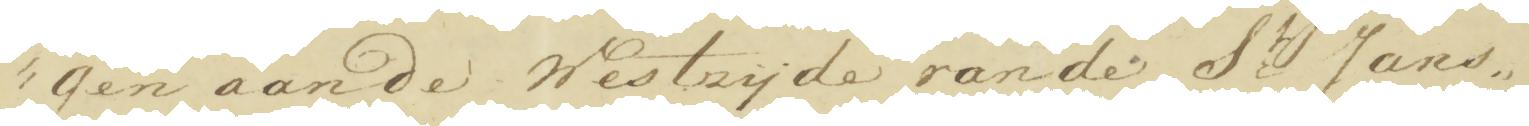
„gen aan de Westzijde van de St Jans„
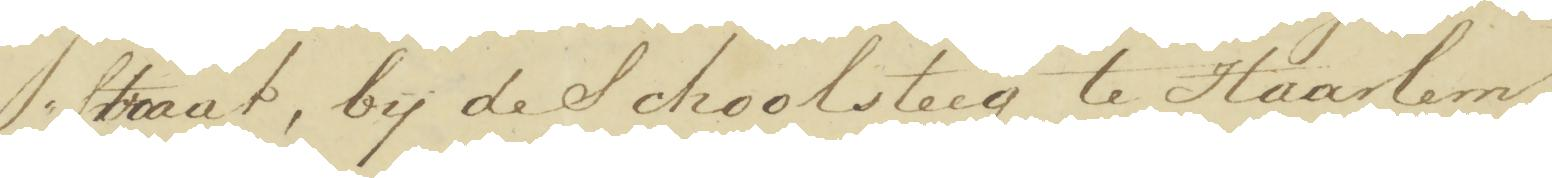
„straat, bij de Schoolsteeg te Haarlem,
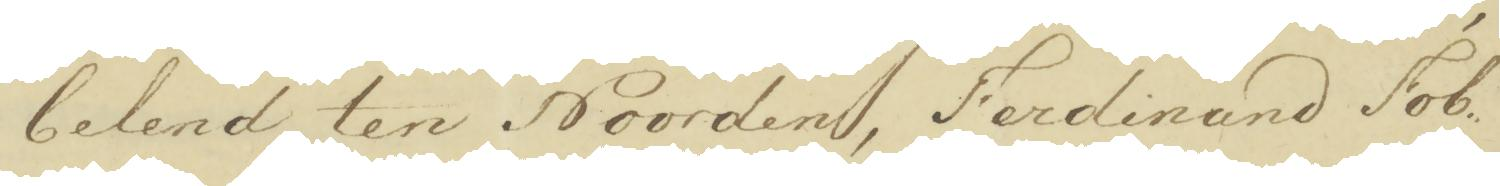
belend ten Noorden, Ferdinand Fob„
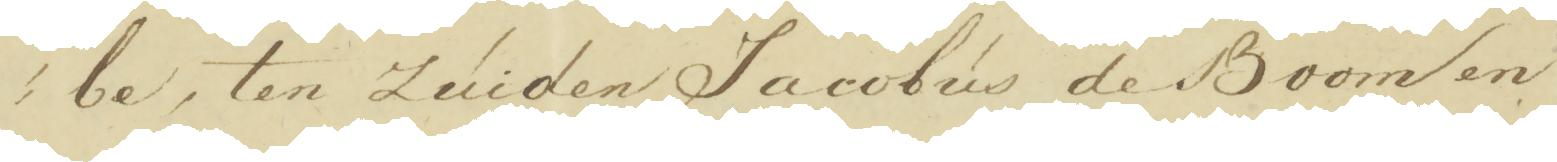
„be, ten zuiden Iacobus de Boom en
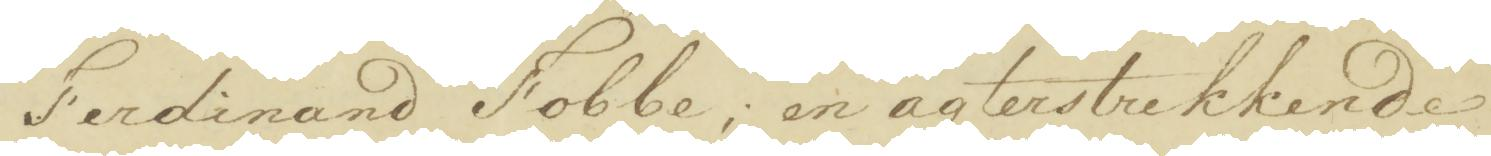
Ferdinand Fobbe; en agterstrekkende
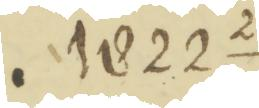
„ 1822
